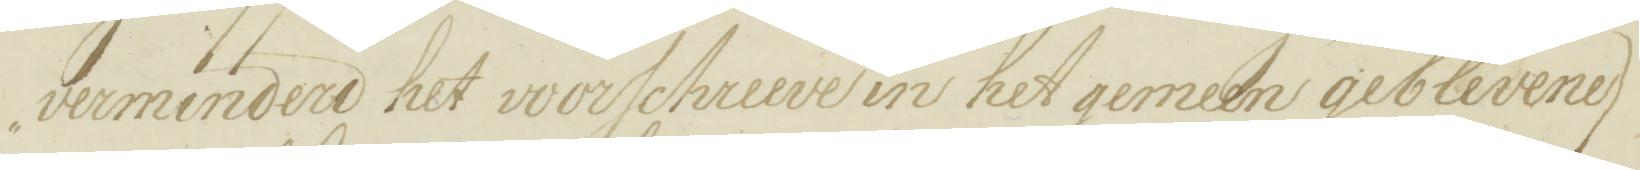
verminderd het voorschreeve in het gemeen geblevene)
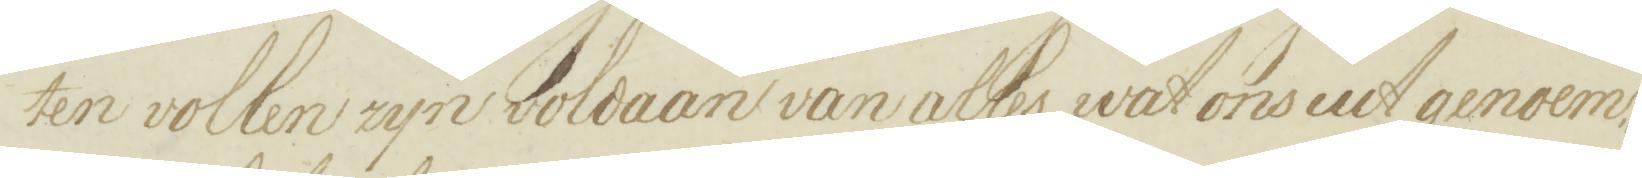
ten vollen zyn voldaan van alles wat ons uit genoem„
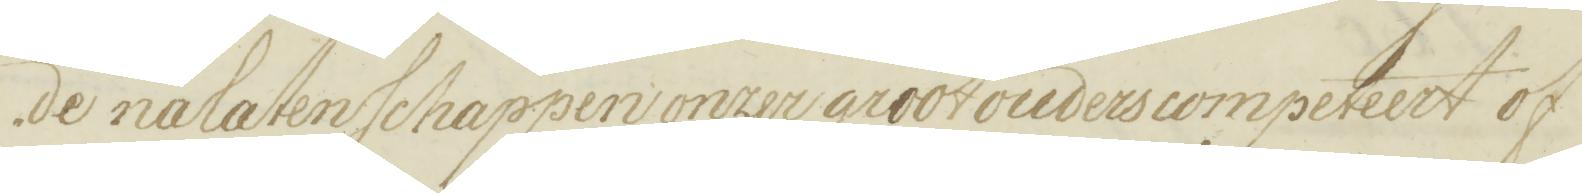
„de nalatenschappen onzer groot ouders competeert of
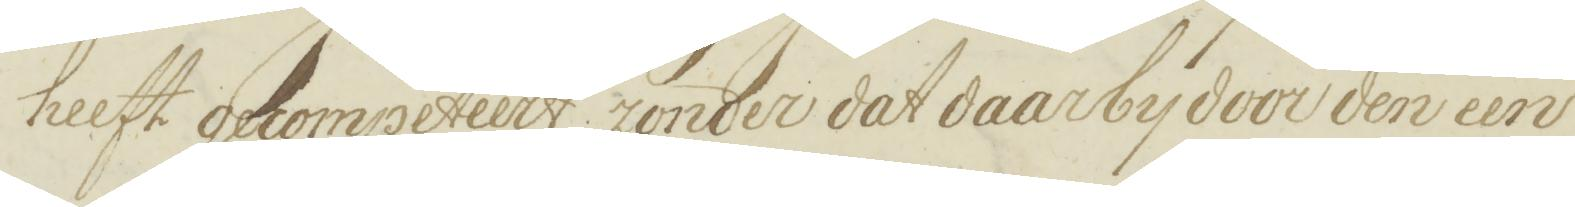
heeft gecompeteert; zonder dat daar by door den een
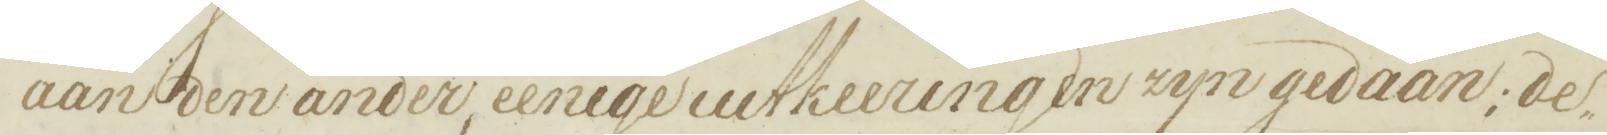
aan den ander, eenige uitkeeringen zyn gedaan; de„
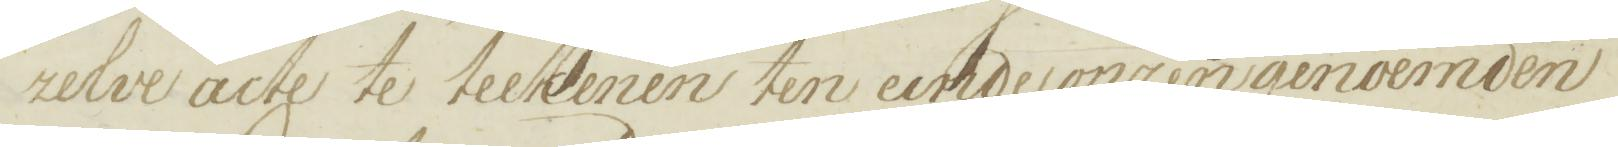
zelve acte te teekenen ten einde onzen genoemden
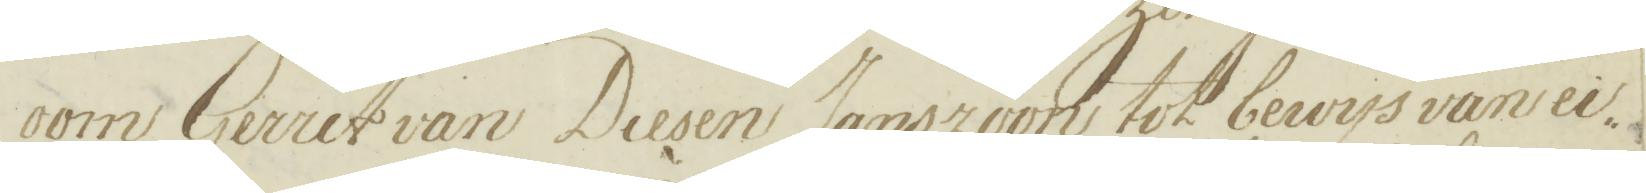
oom Gerrit van Diesen Janszoon tot bewys van ei„
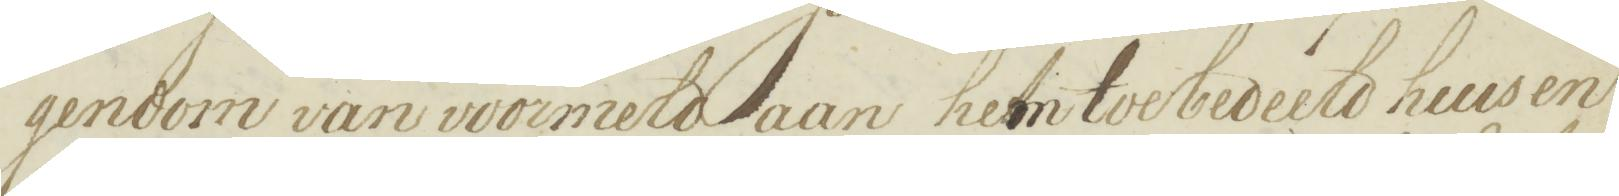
gendom van voormeld aan hem toebedeeld huis en
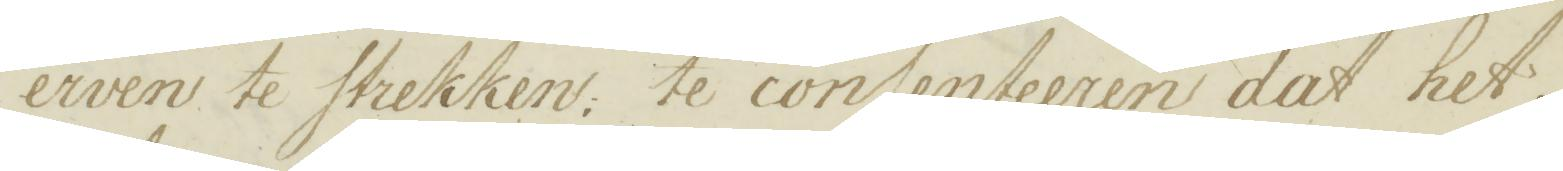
erven te strekken; te consenteeren dat het
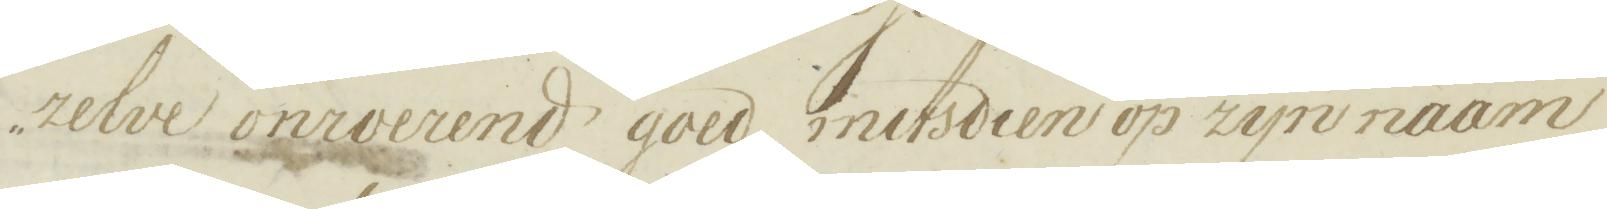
„zelve onroerend goed mitsdien op zyn naam
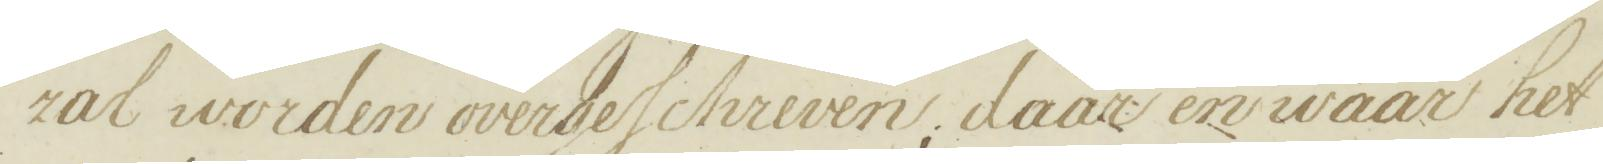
zal worden overgeschreven, daar en waar het
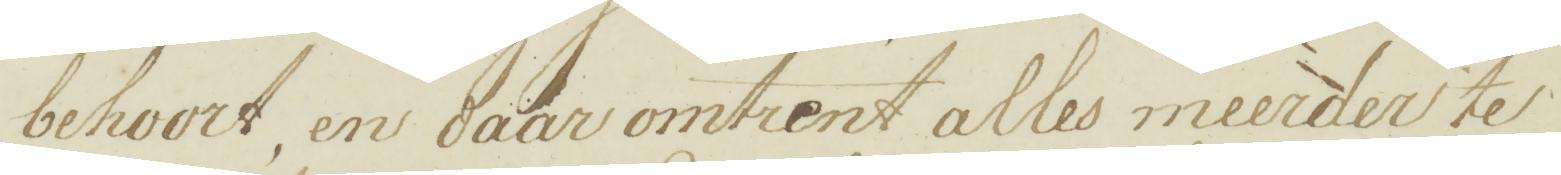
behoort, en daar omtrent alles meerder te
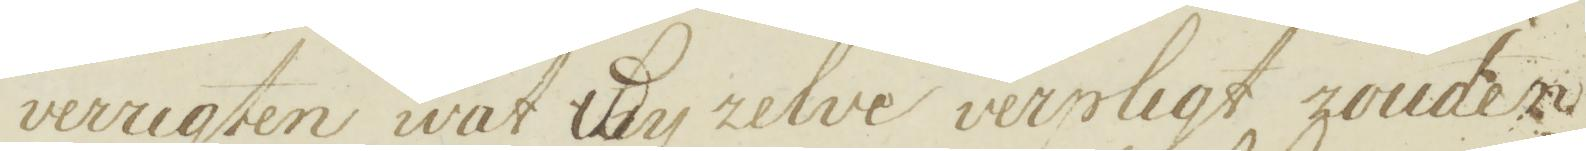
verrigten wat hyzelve verpligt zouden
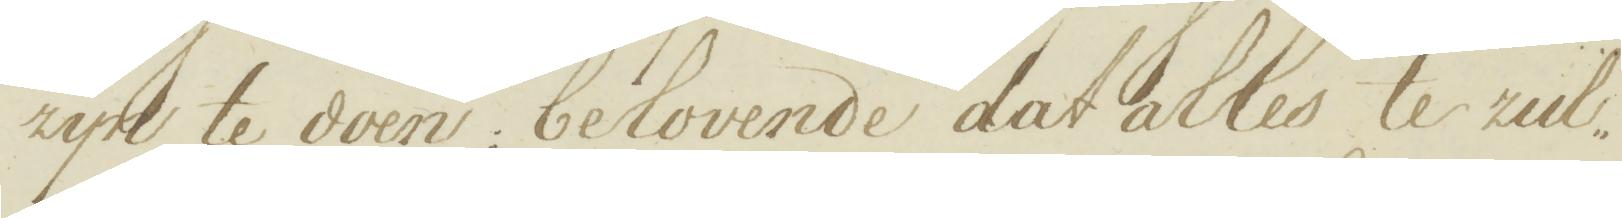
zyn te doen; belovende dat alles te zul„
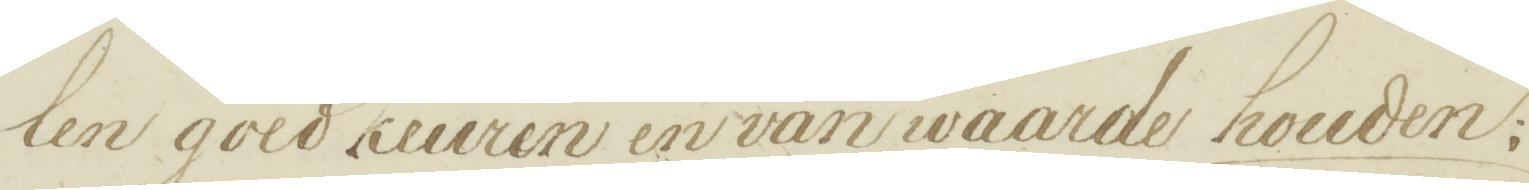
len goedkeuren en van waarde houden:
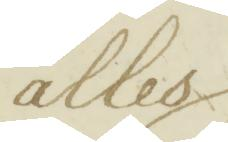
alles
